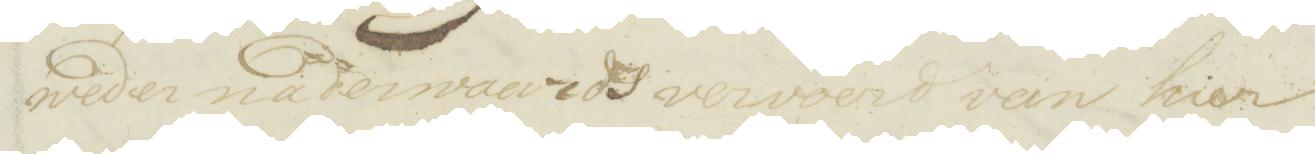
weder derwaards vervoerd van hier
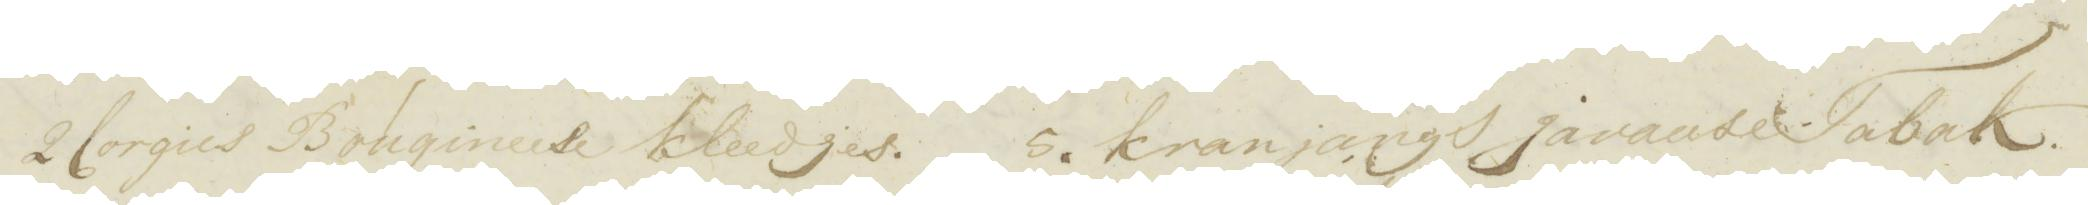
2 Corgies Bougineese kleedjes: 5. Kranjangs javaase Tabak.
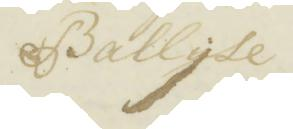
Ballijse
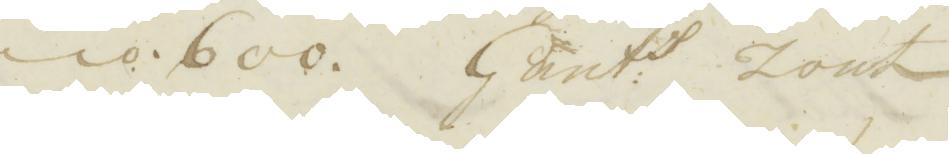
_o 600. Gant:s zout
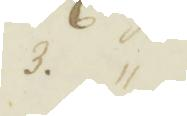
3 „
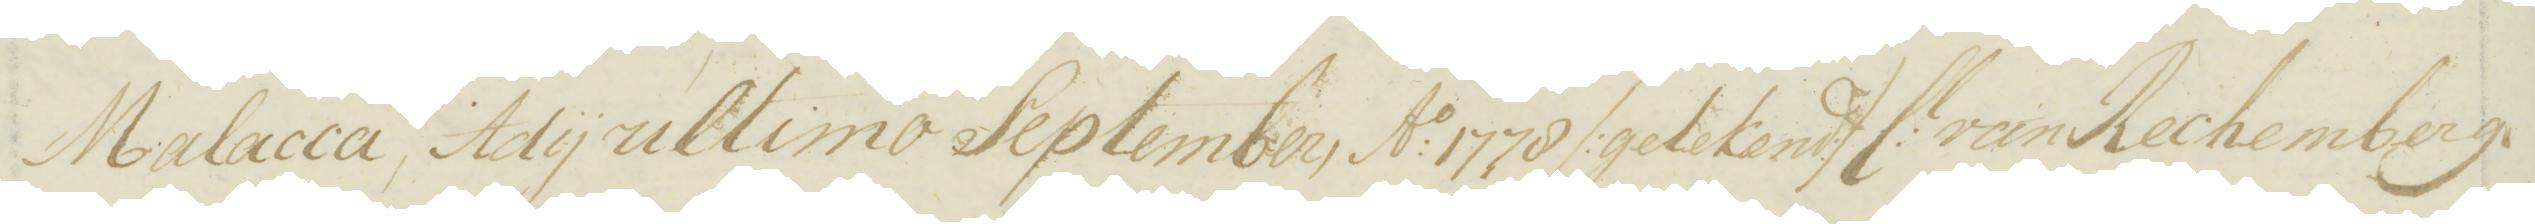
Malacca, Adij ultimo September, A:o 1778 /:getekend:/ C:s van Rechemberg.
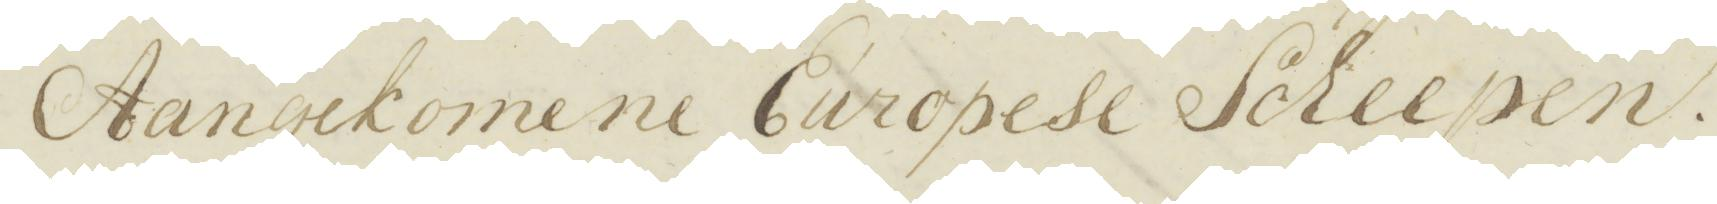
Aangekomene Europese scheepen.
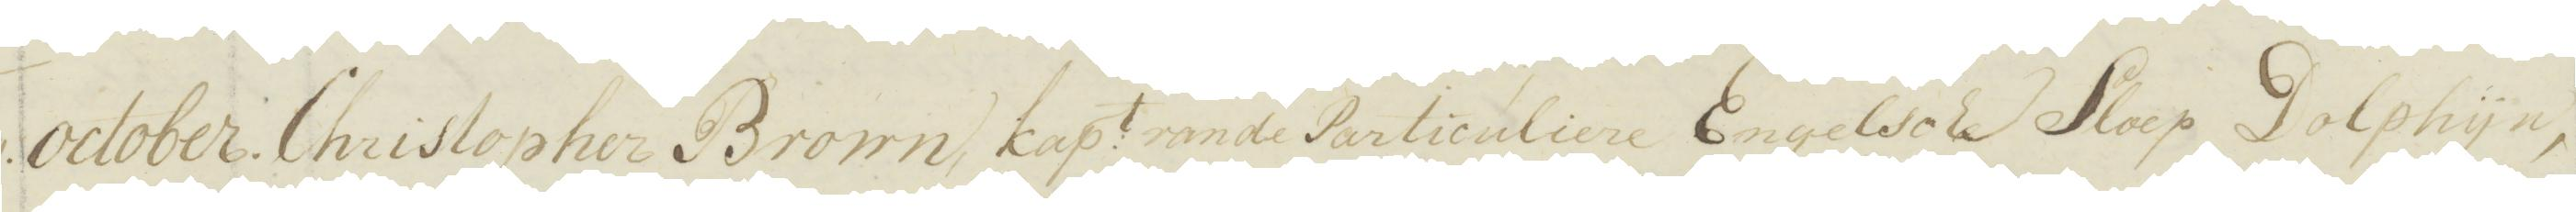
october Christopher Bronn, kap:t van de Particuliere Engelsche Sloep Dolphijn,
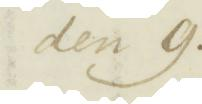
den 9.
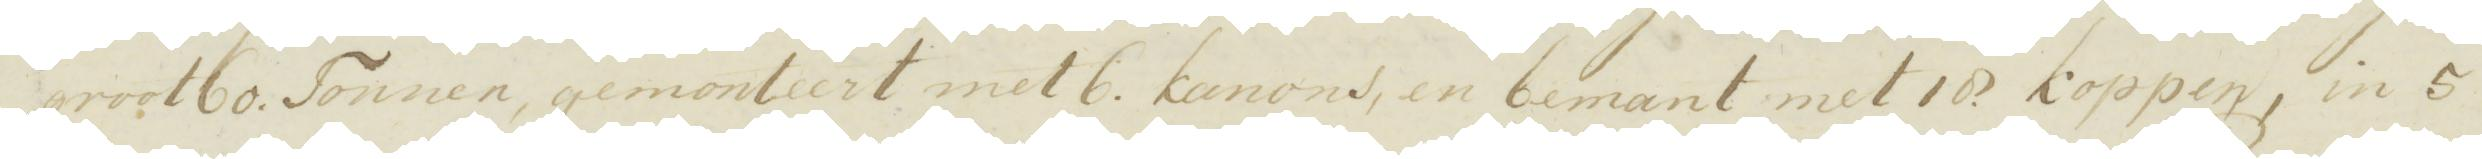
groot 60. Tonnen, gemonteert met 6. kanons, en bemant met 18. koppen, in 5
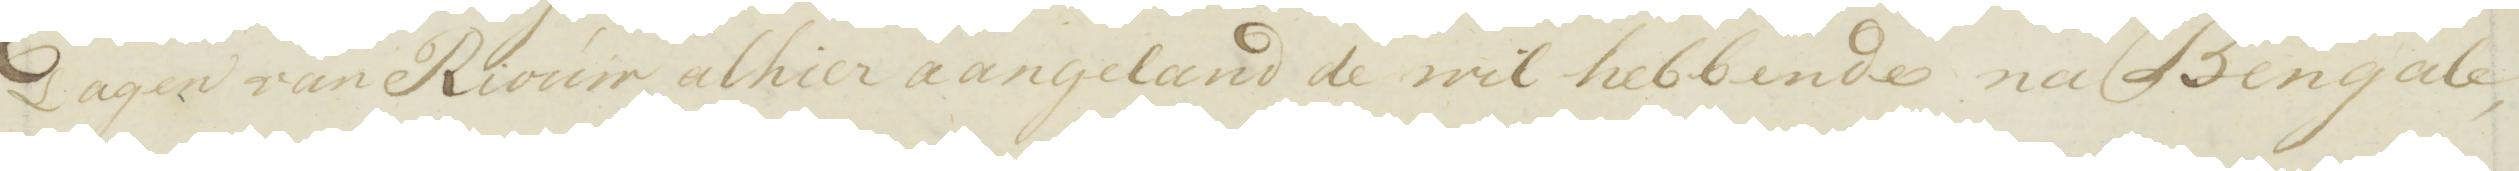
dagen van Riouw alhier aangeland de wil hebbende na Bengale„
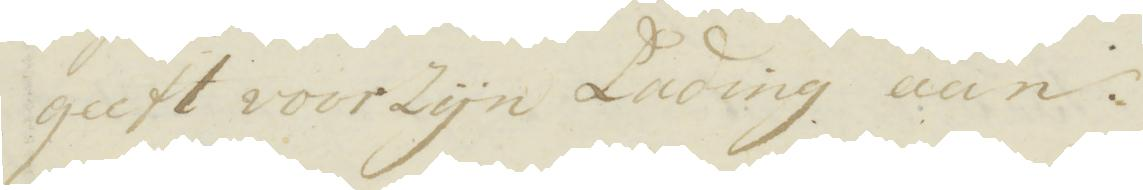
geeft voor zijn Lading aan
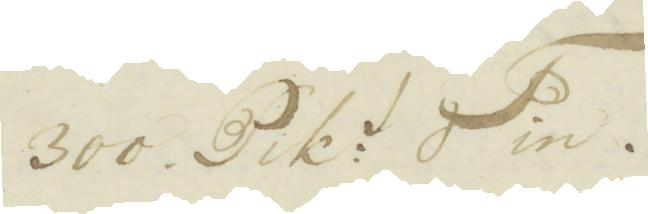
300. Pik:s do in.
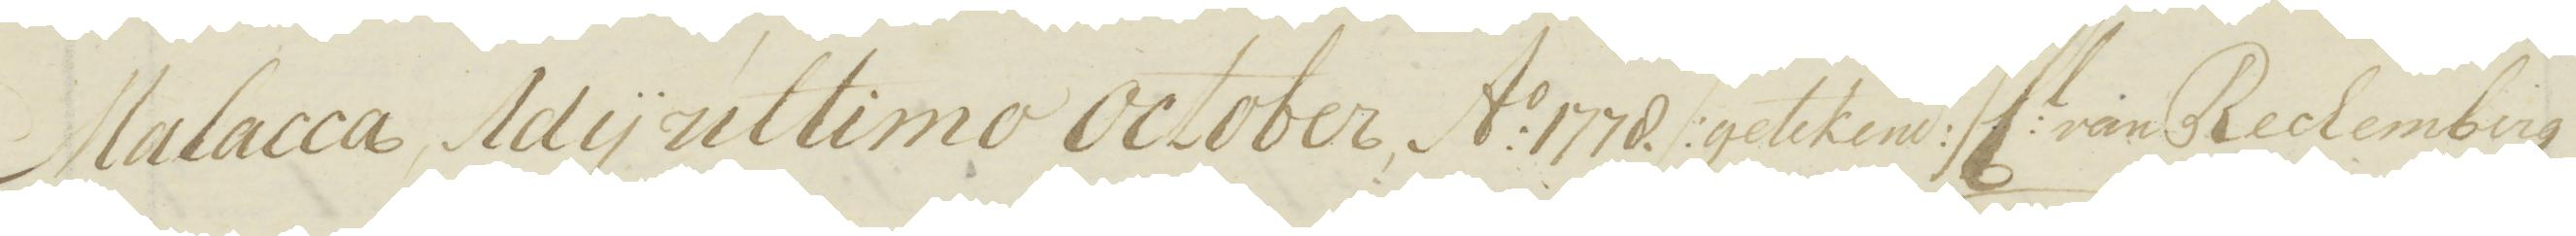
Malacca, Adij ultimo October, A:o 1778. /:getekend:/ C:s van Rechemberg
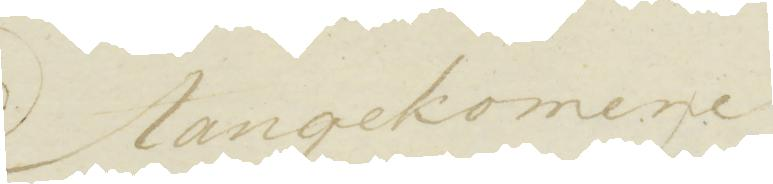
Aangekomene
